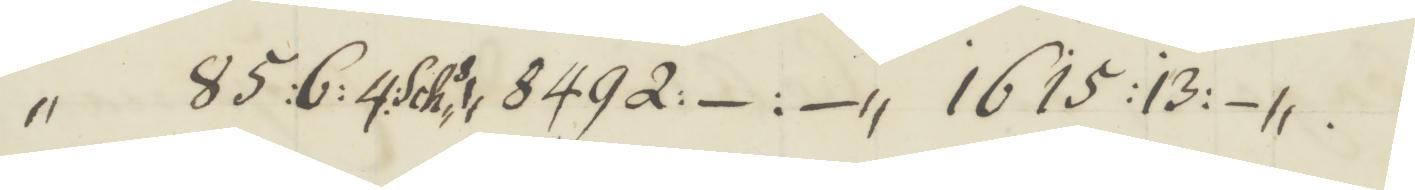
„ 85:6:4:sch„s', 8492:—:—„ 1615:13:-„.
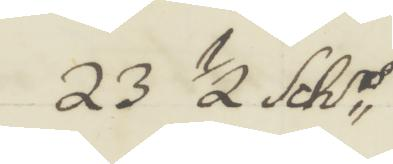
23 ½ sch„s
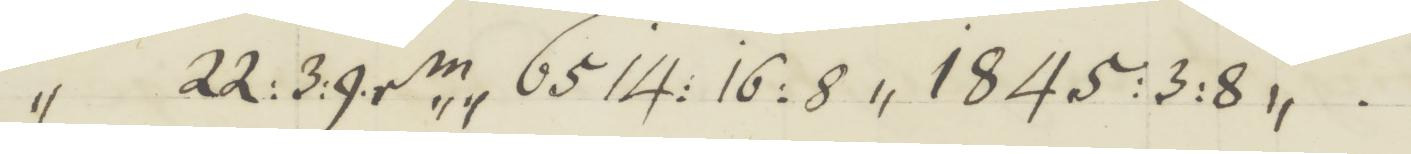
„ 22:3:9.r„m„ 6514:16:8„ 1845:3:8„.
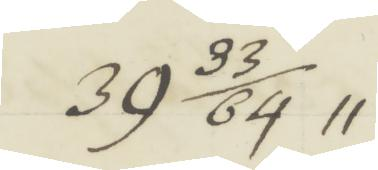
39 33/64 „
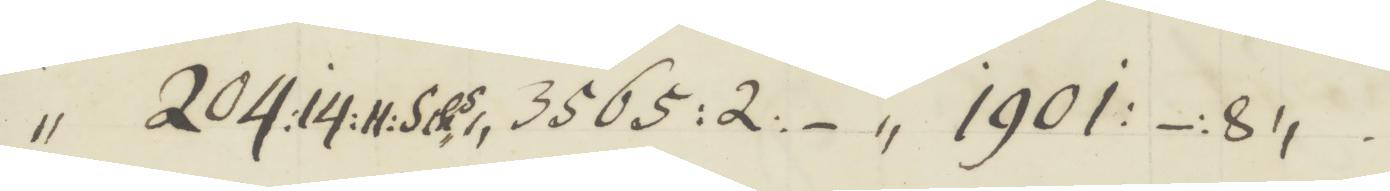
„ 204:14:h:sch„s,' 3565:2:— „ 1901:—:8„
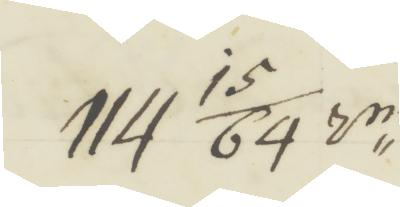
114 15/64 r„m
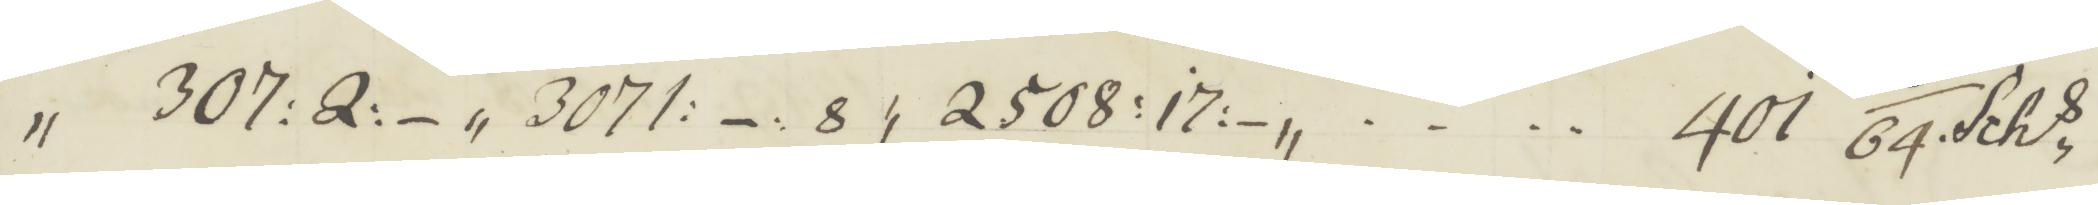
„ 307: 2:—„ 3071:—:8 „ 2508:17:—„ . . . . 401 53/64 sch„s
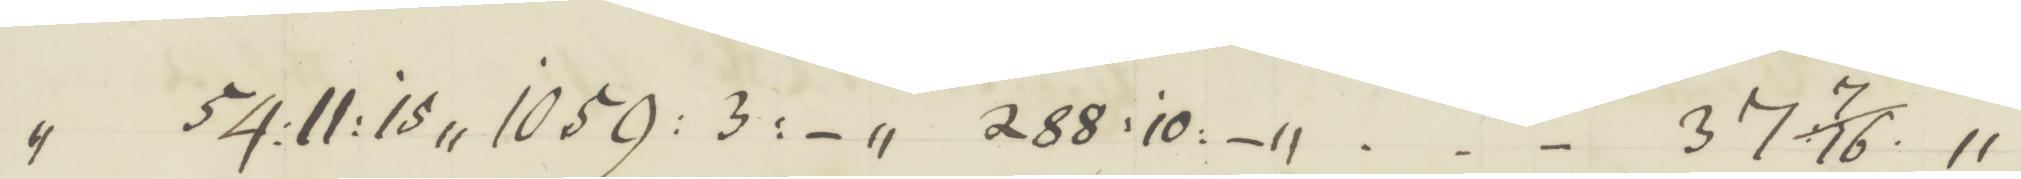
„ 54:11:15„ 1059:3:—„ 288:10:—„ 37 7/16. „
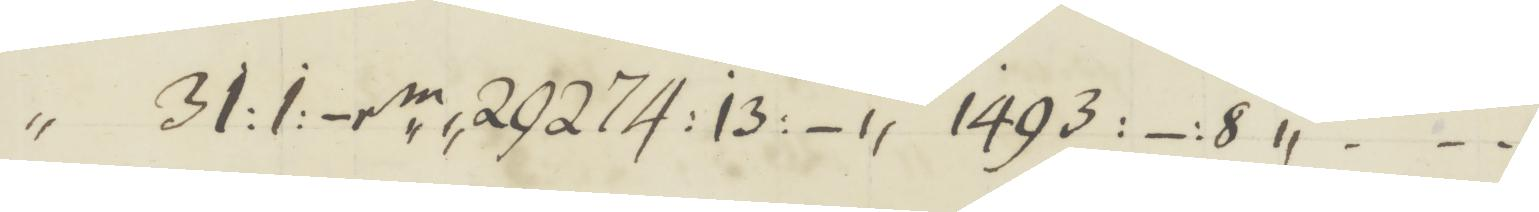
„ 31:1:—r„m 29274:13:—„ 1493:—:8 „- - -
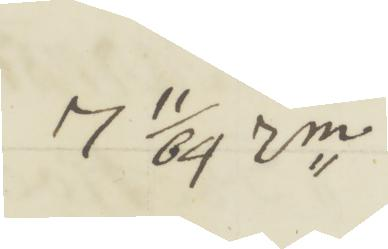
7 11/64 r„m
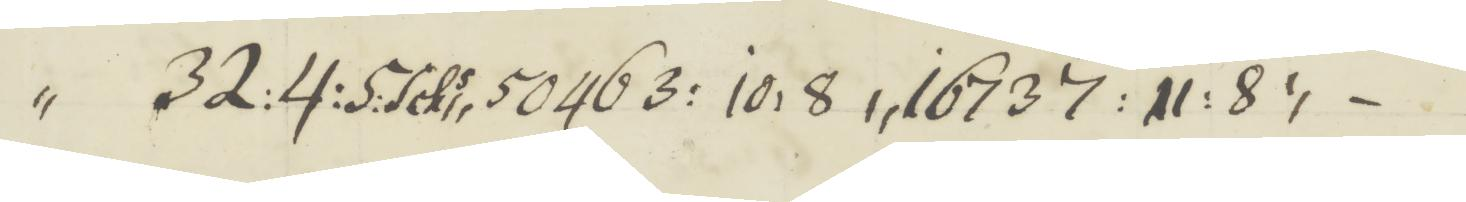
„ 32:4:5: Sch„s 50463: 10,8 „16737:11:8: -
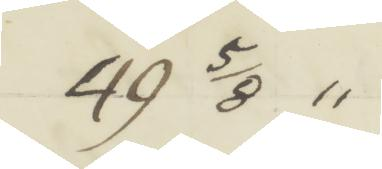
49 5/8 „
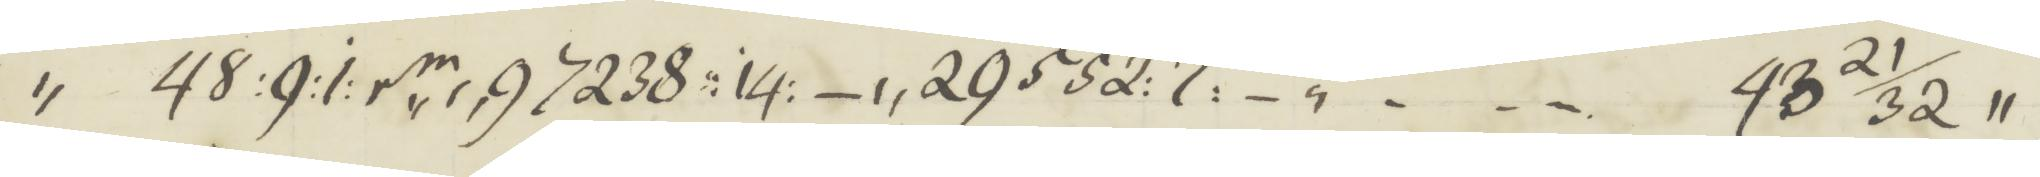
„ 48:9:1:r„m,, 97238:14:—„29552:7:— „ - - - 43 21/32 „
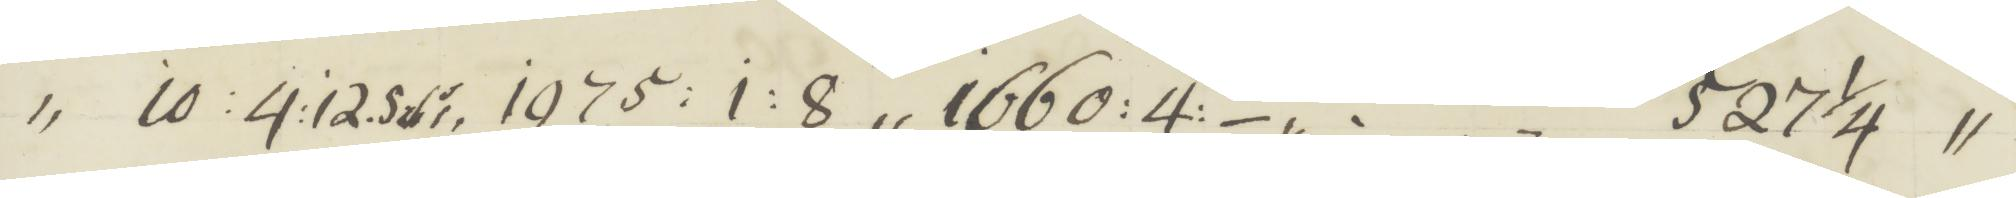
„ 10:4:12.sch,s, 1975: 1:8 „ 1660:4:—„ . . - 527¼ „
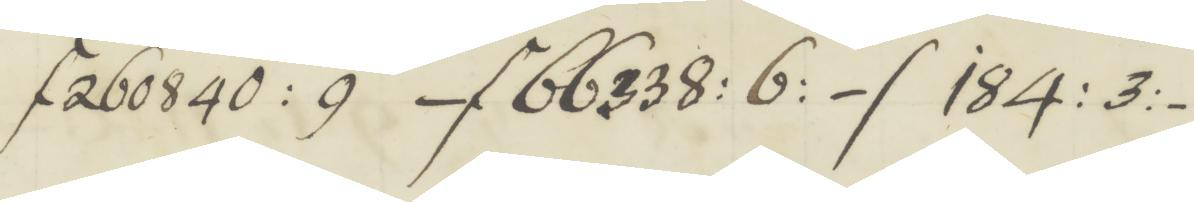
ƒ260840: 9 —ƒ66338:6:—ƒ 184:3:—
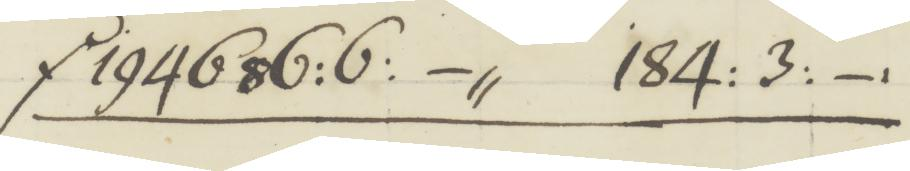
ƒ194686:6:—„ 184:3:—.
